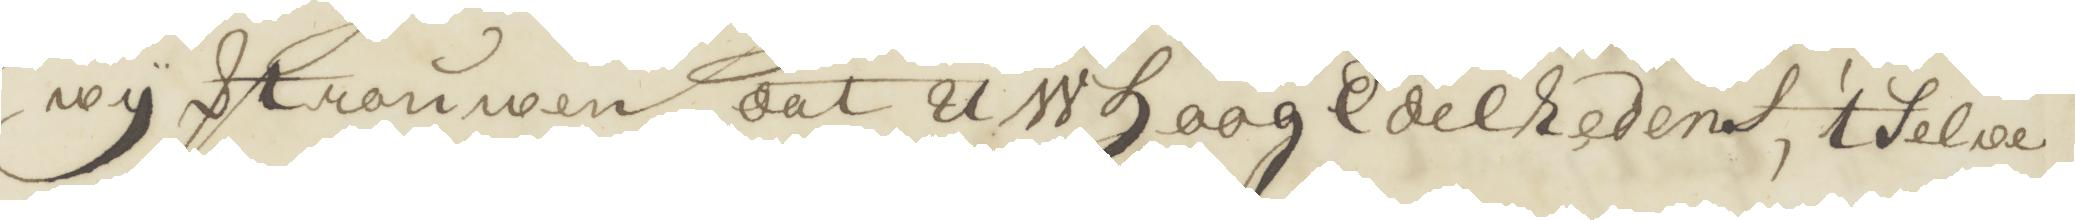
wij vertrouwen, dat UW Hoog Edelhedens, ’t selve
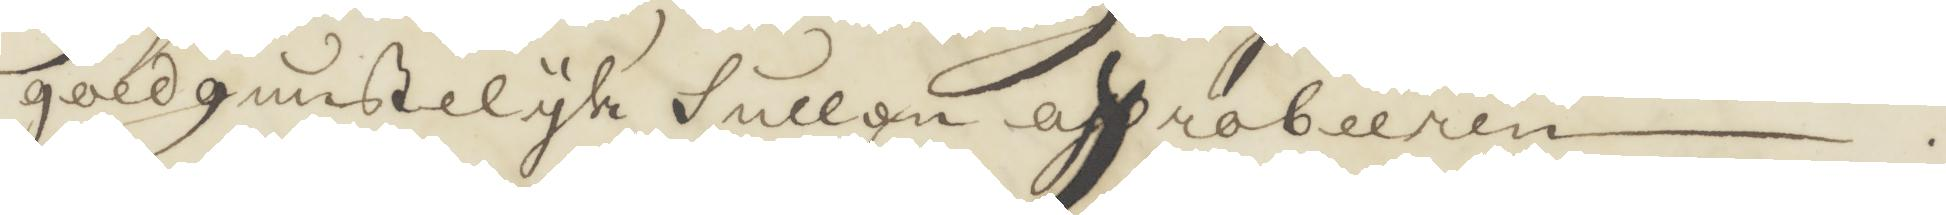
goed gunstelijk sullen approbeeren.
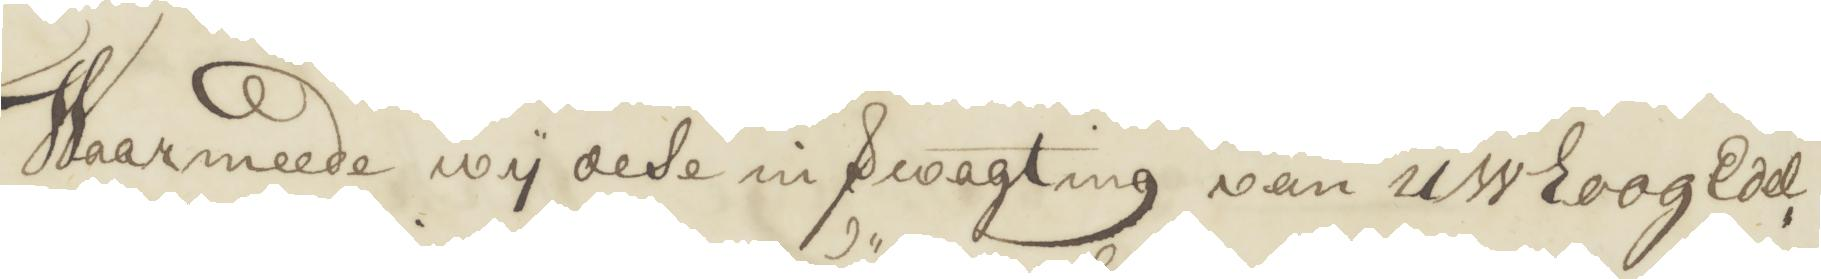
Waarmeede wij dese in verwagting van UW hoog Edel„
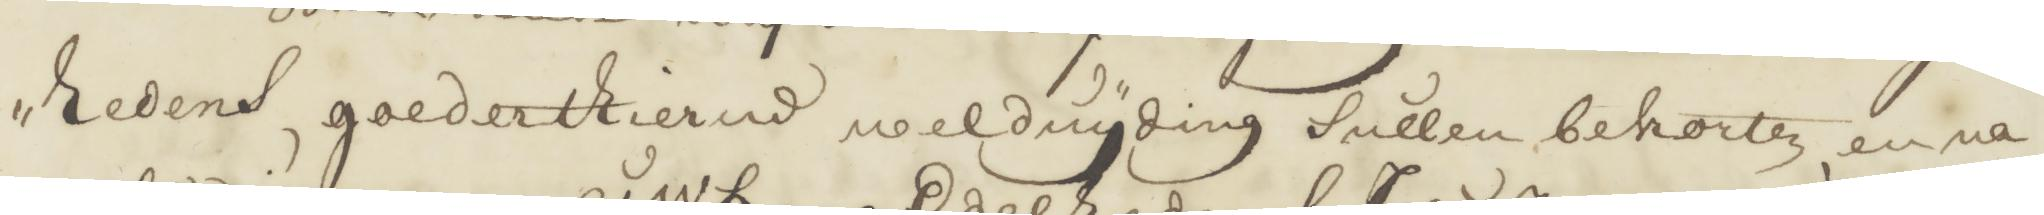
„hedens, goederthierne welduijding sullen bekorten en na
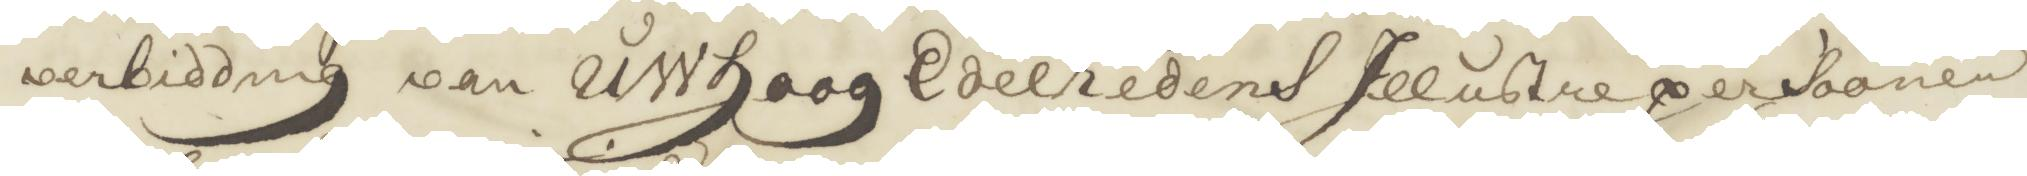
verbidding van UW Hoog Edelhedens Jllustre persoonen
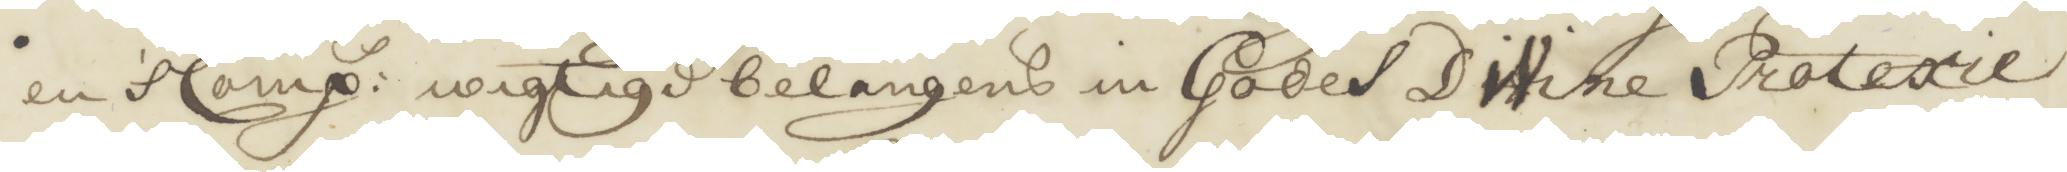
en ’sComp:s wigtige belangens in Godes Divine Protexie
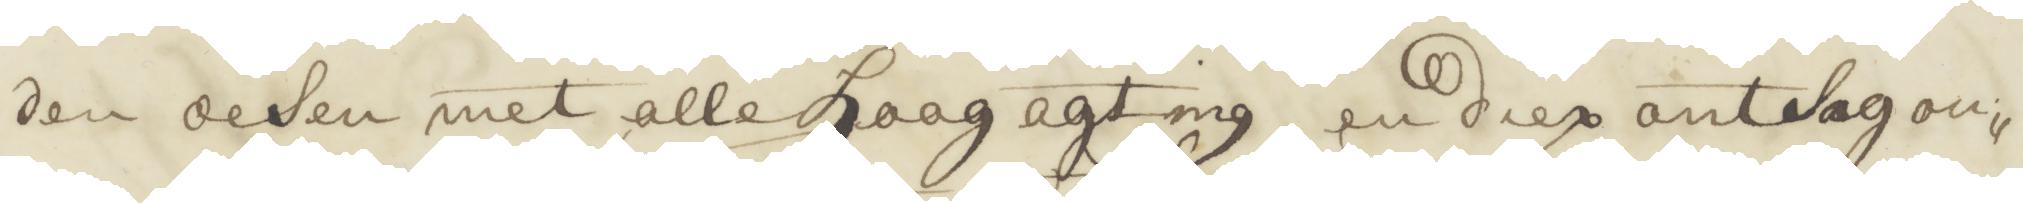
den desen met alle hoog agting, en diep ontsag on„
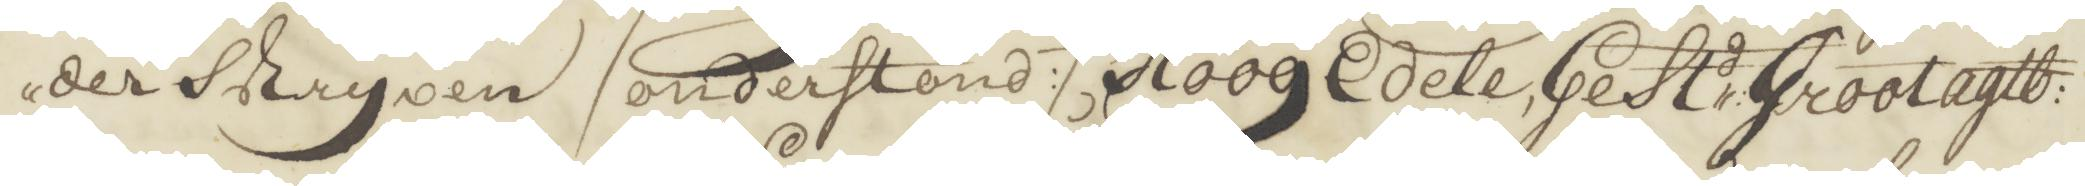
„der schrijven /onderstond:/ Hoog Edele, Gest„g Groot agtb:
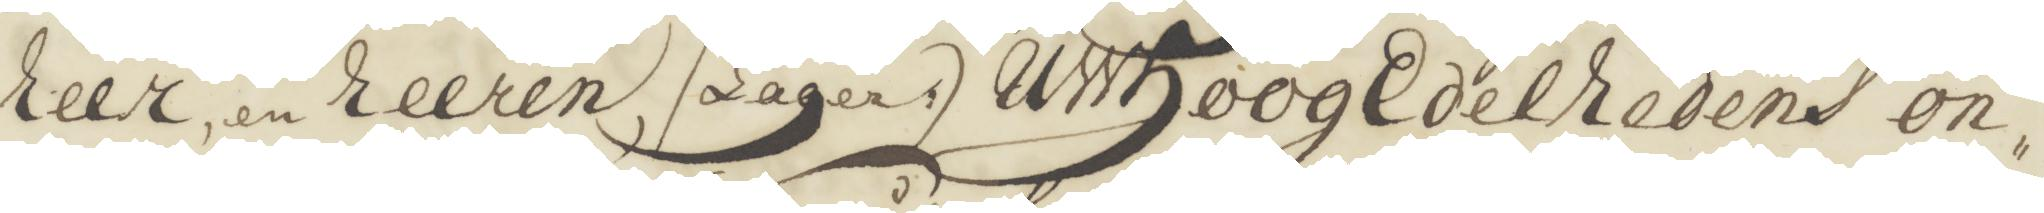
heer, en heeren, /Lager:/ UW Hoog Edelhedens on„
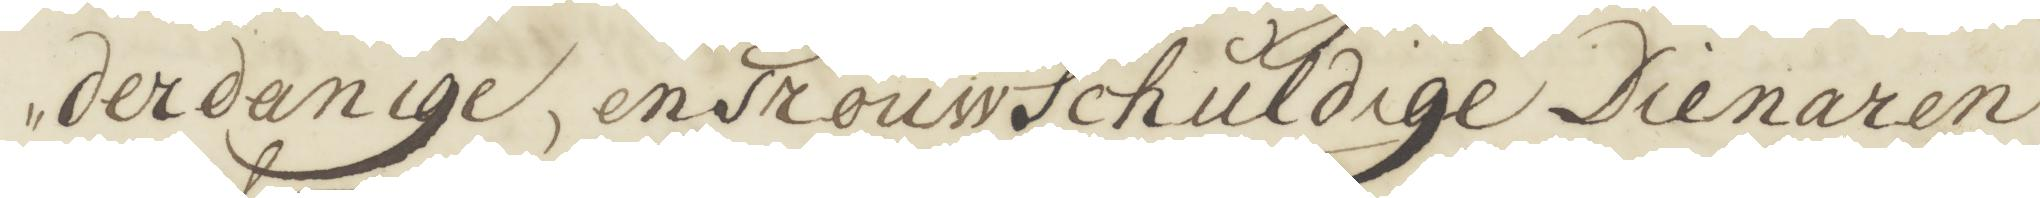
„derdanige, en Trouwschuldige Dienaren
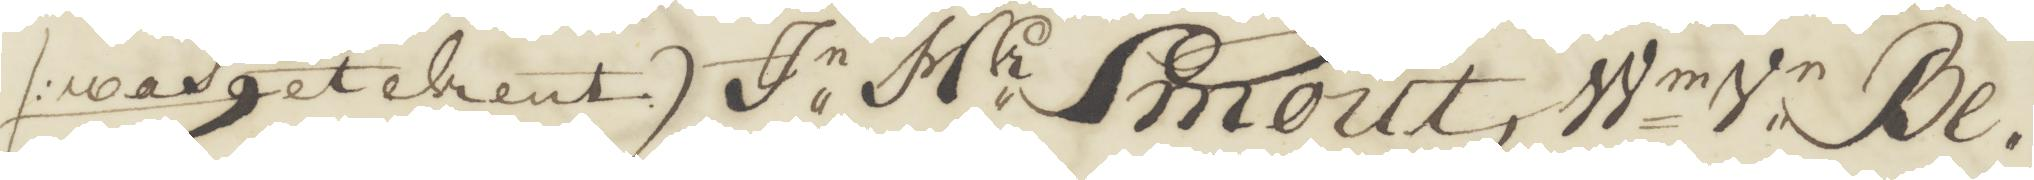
/:was getekent:) J„n M„k smout, W=m V„n Be„
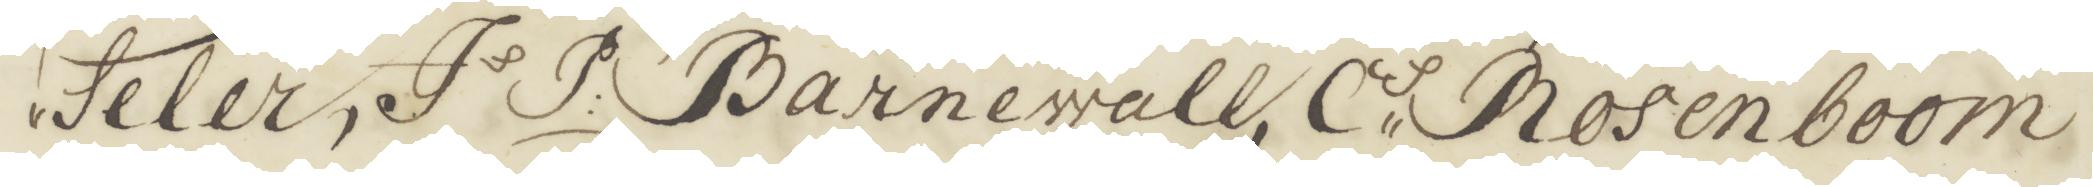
„seler, Js J: Barnewall, C„s Rosenboom
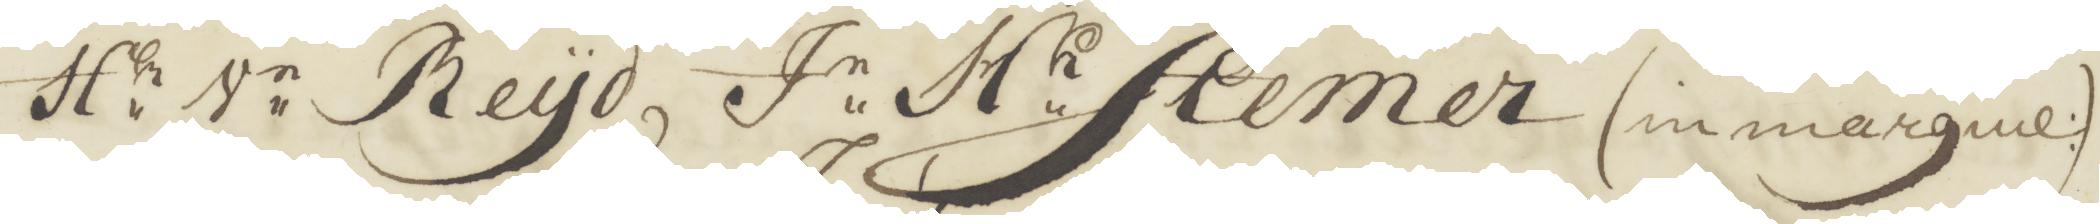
H„k V„n Reijd, J„n M„k stemer (in margine:)
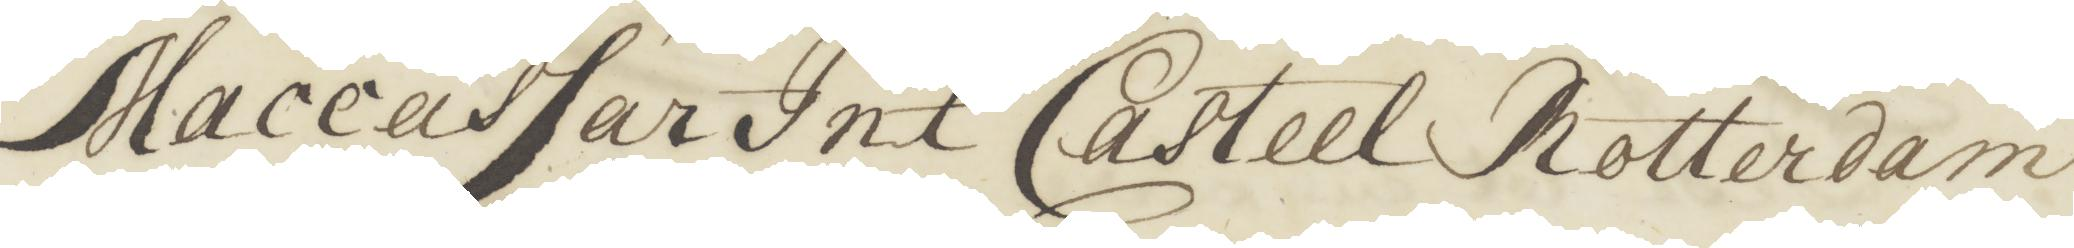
Maccassar In't Casteel Rotterdam
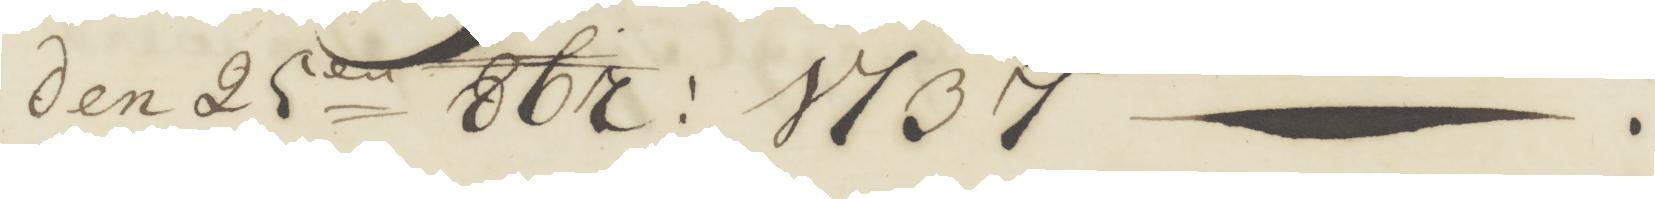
den 25=en 8br: 1737 —.
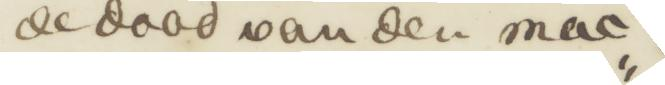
de dood van den mac„
